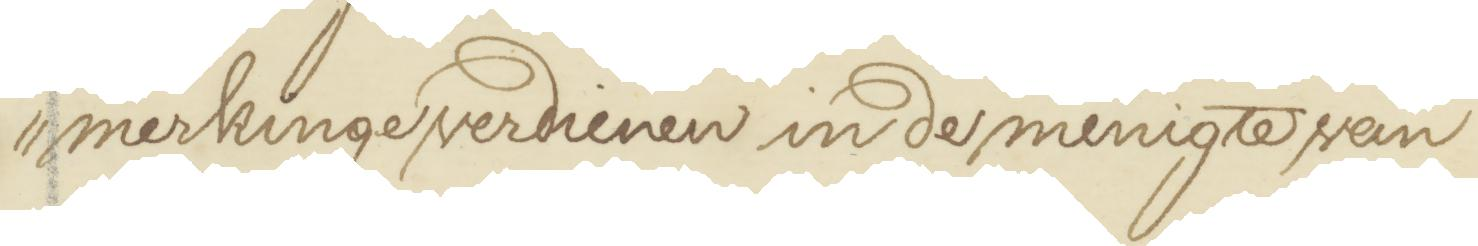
„merkinge verdienen in de menigte van
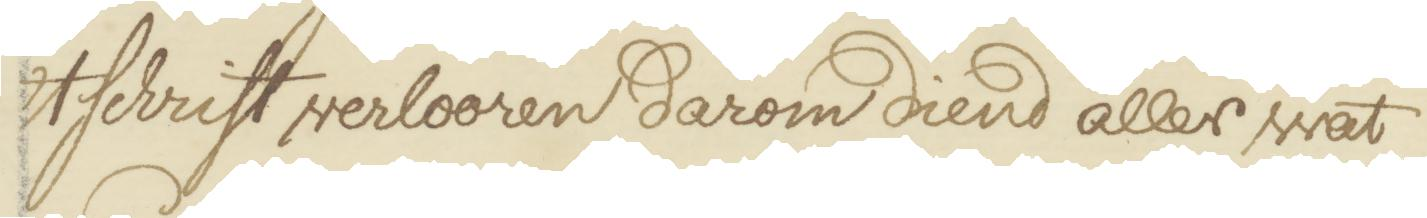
’t schrift verlooren darom diend alles wat
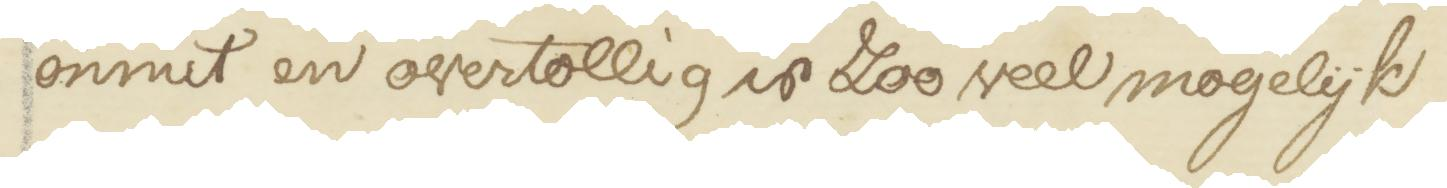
onnut en overtollig is zoo veel mogelijk
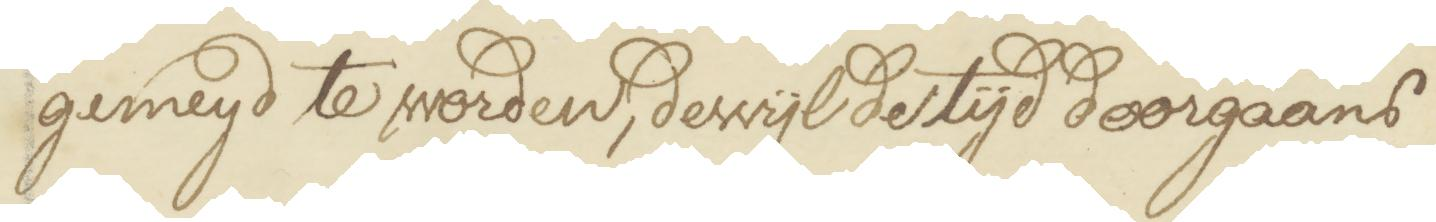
gemeyd te worden, dewijl de tijd doorgaans
